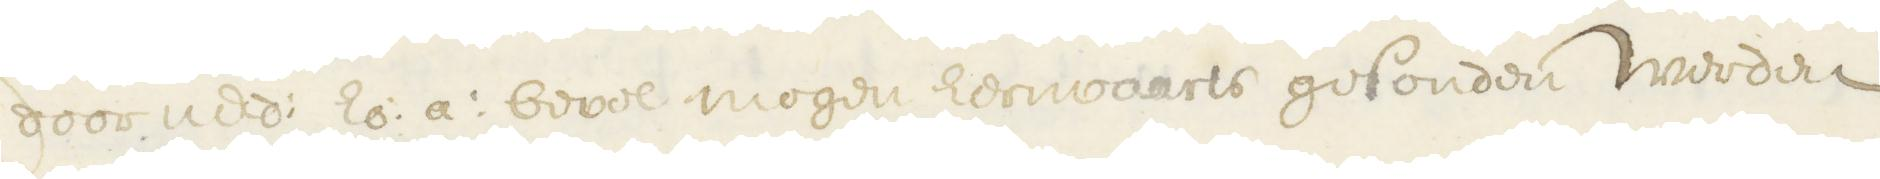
door uEd: ho: a: bevel mogen herwaarts gesonden werden
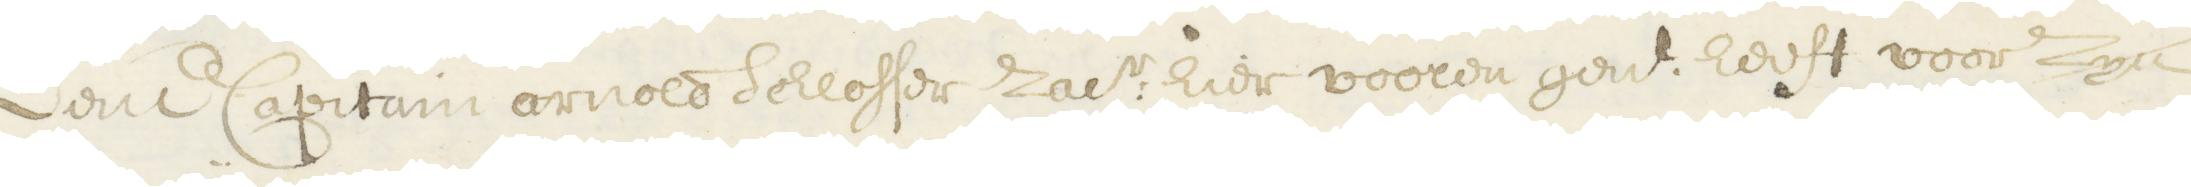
Den E Capitain arnold schlosser zal:r hier vooren gen:t heeft voor zyn
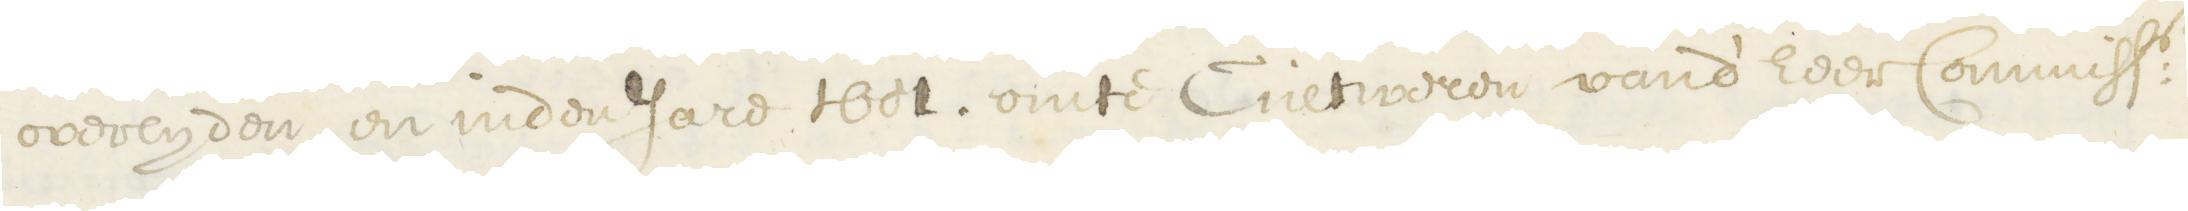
overlijden, en inden Jare 1681. omte Cultiveren vand’ heer Commiss:s
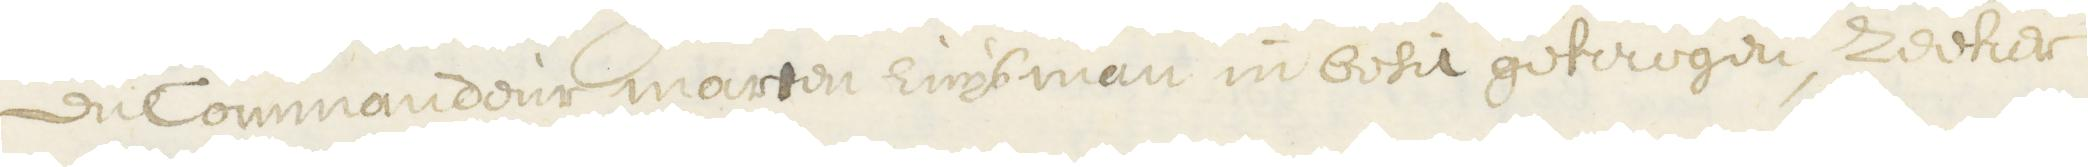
en Commandeur marten huijsman in besit gekregen, zeeker
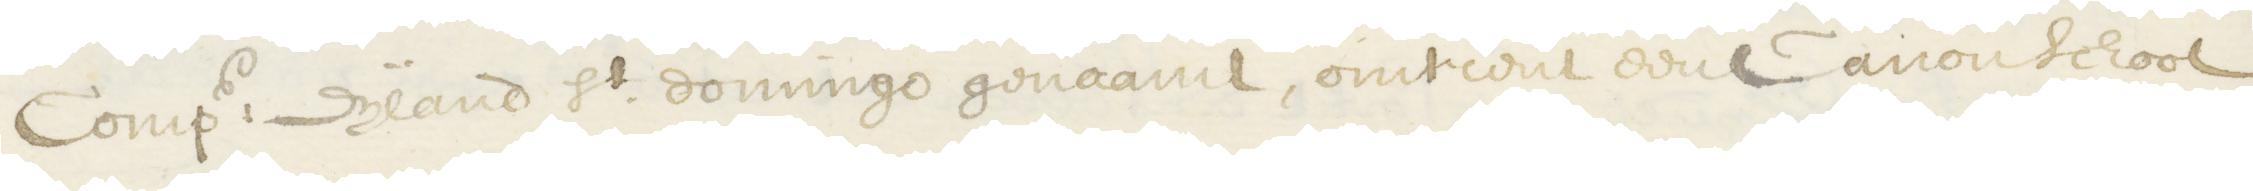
Comp:s Eijland s.t domingo genaamt, omtrent den Canon schoot
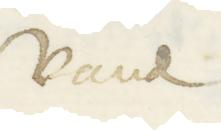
vand
